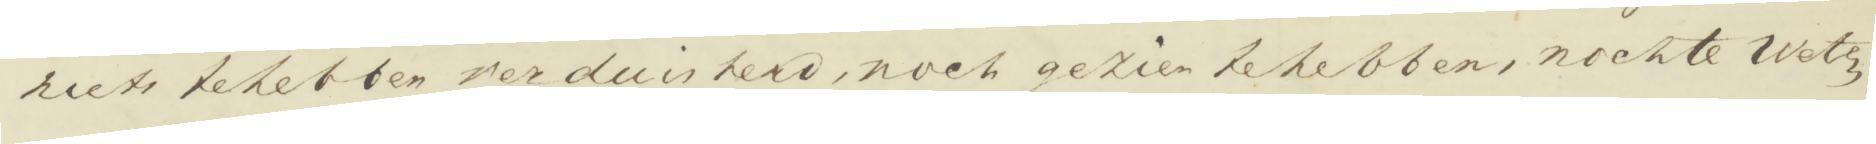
niets te hebben verduisterd, noch gezien te hebben, nochte weten
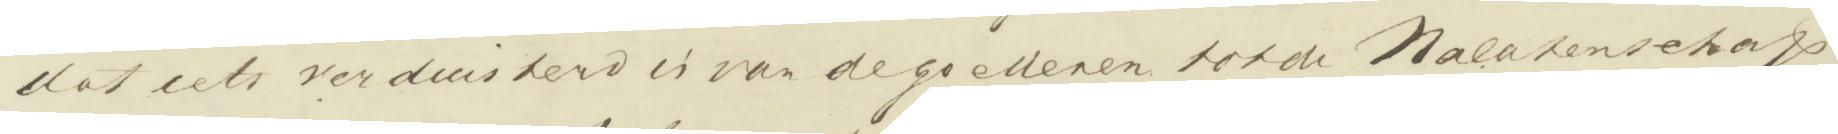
dat iets verduisterd is van de goederen tot de Nalatenschap
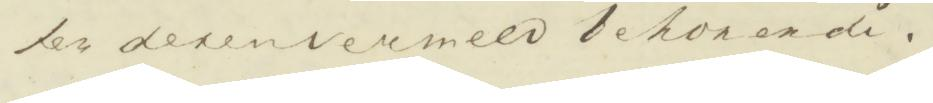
ten desen vermeld behorende.
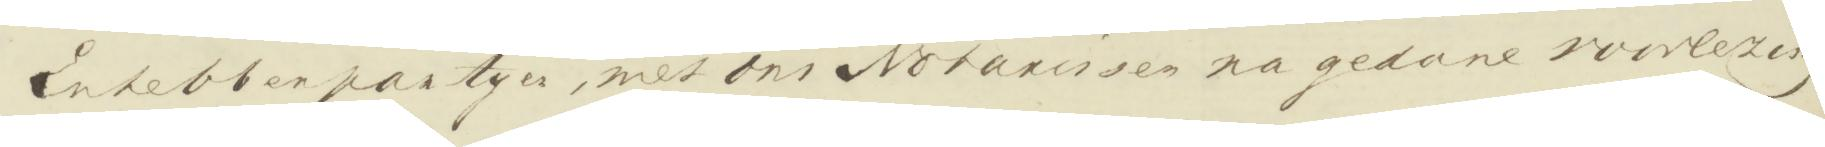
En hebben partyen, met ons Notarissen na gedane voorlezing
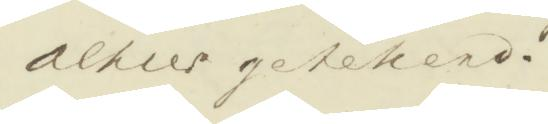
alhier getekend.
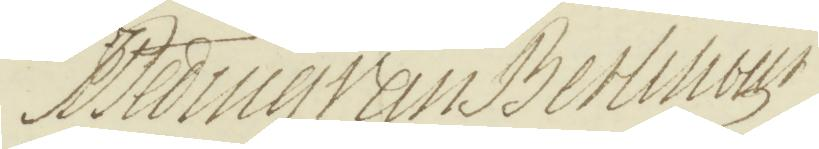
ITedingvanBerkhout
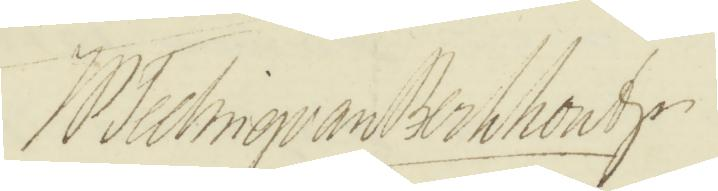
IPTeedingvanBerkhout
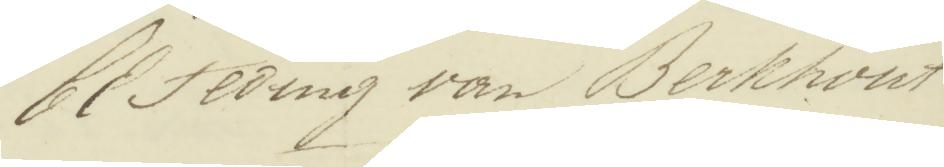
CE Teding van Berkhout
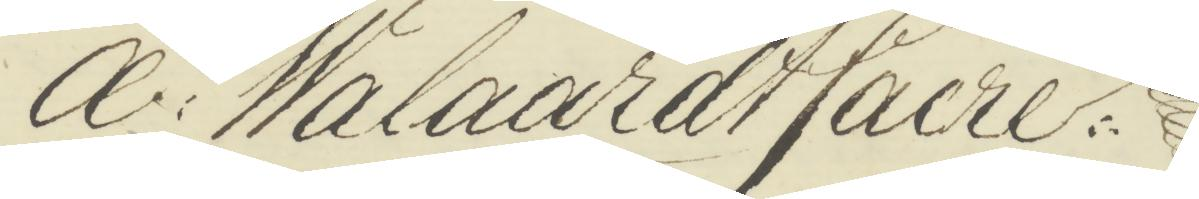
A: Walaardt Sacré:.
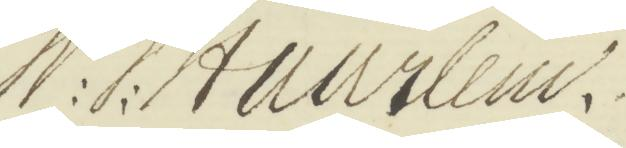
W:V: Haarlem.
